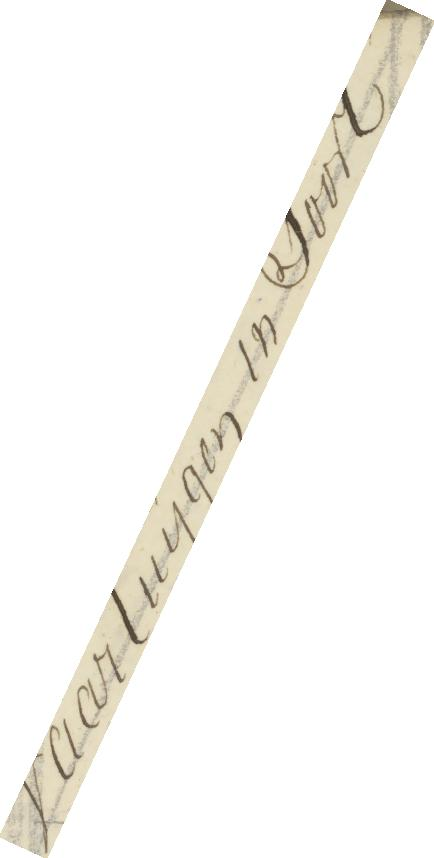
Vaartuijgen in Soort
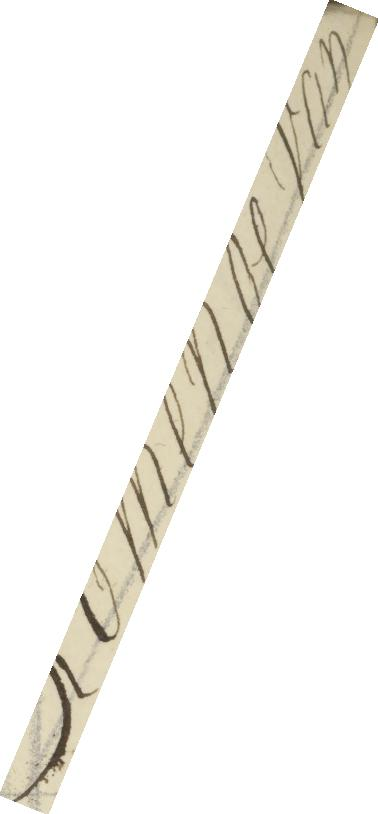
Komende van
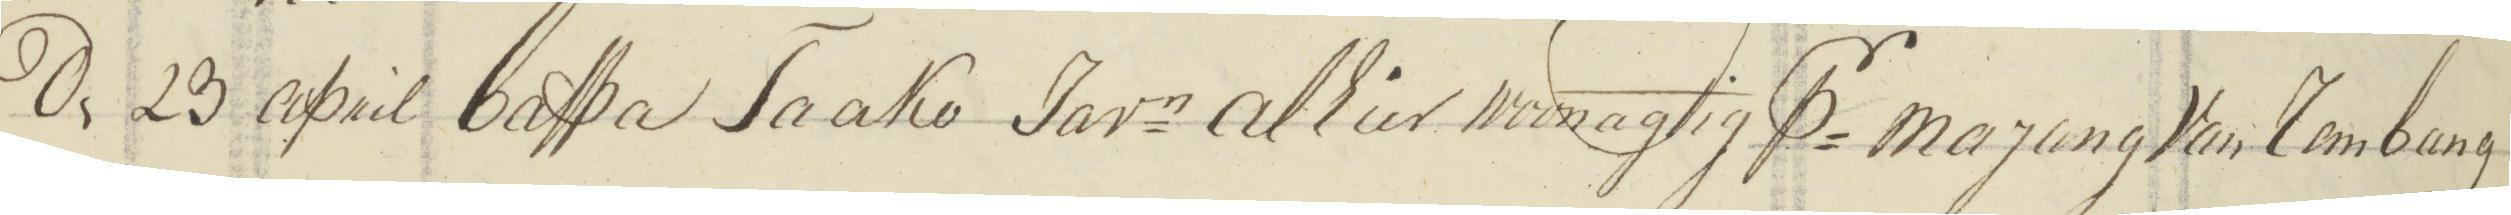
den 23 april bappa Taako Iav=n alhier woonagtig P=r majang Van Rembang
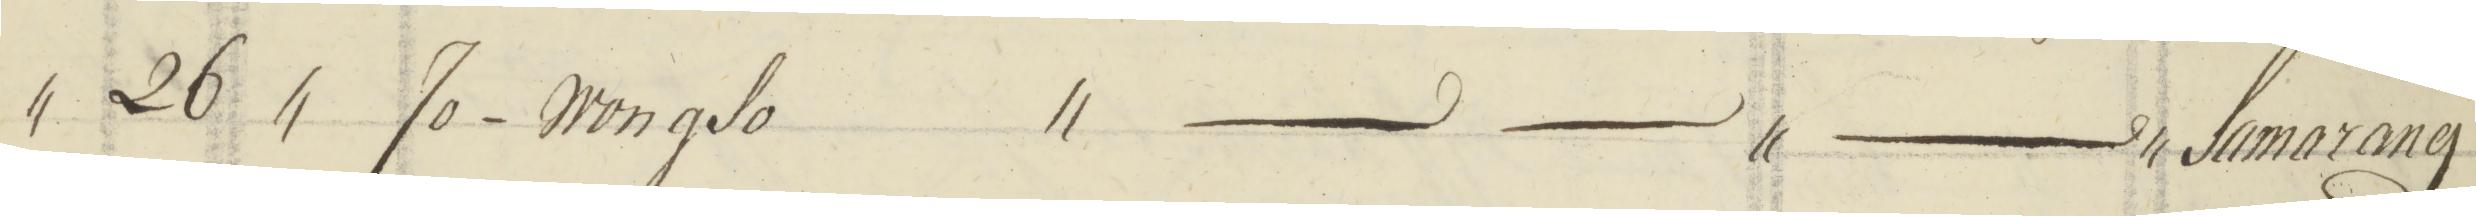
„ 26 „ Jo-wongso „ Do — „ Do „ Samarang
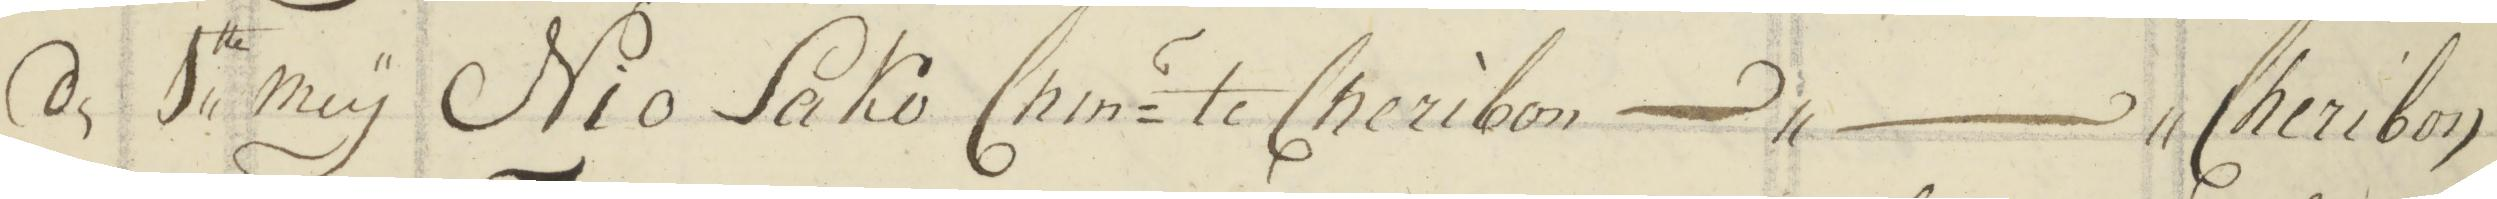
den 1„ste meij Nio Sako Chin=s te Cheribon Do „ Do „ Cheribon
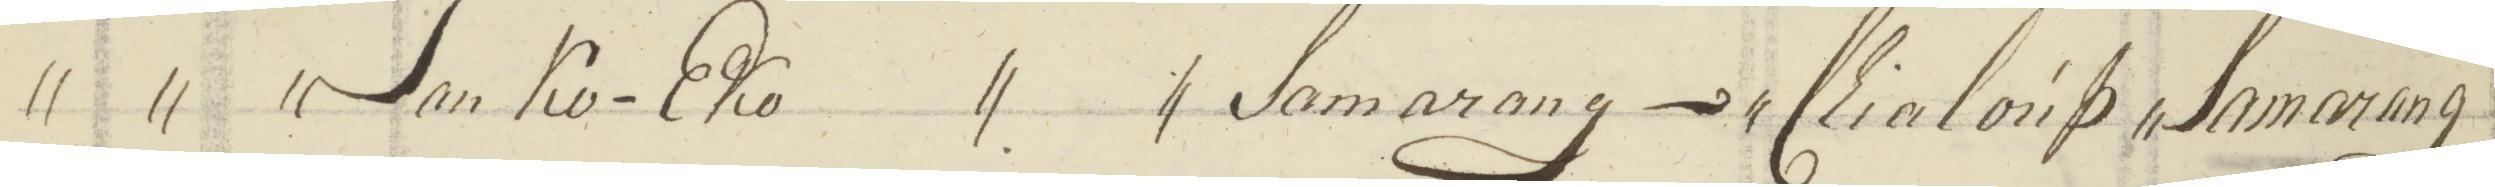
„ „ „ Tan ko-Eko „ „ Samarang — „ Chialoup „ Samarang
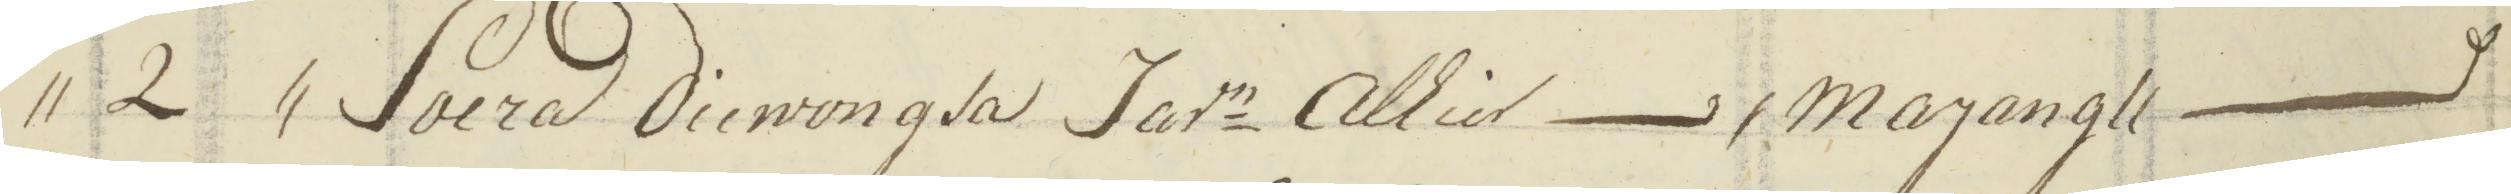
„ 2 „ Soera diewongsa Iav=n Alhier — „ majang „ Do
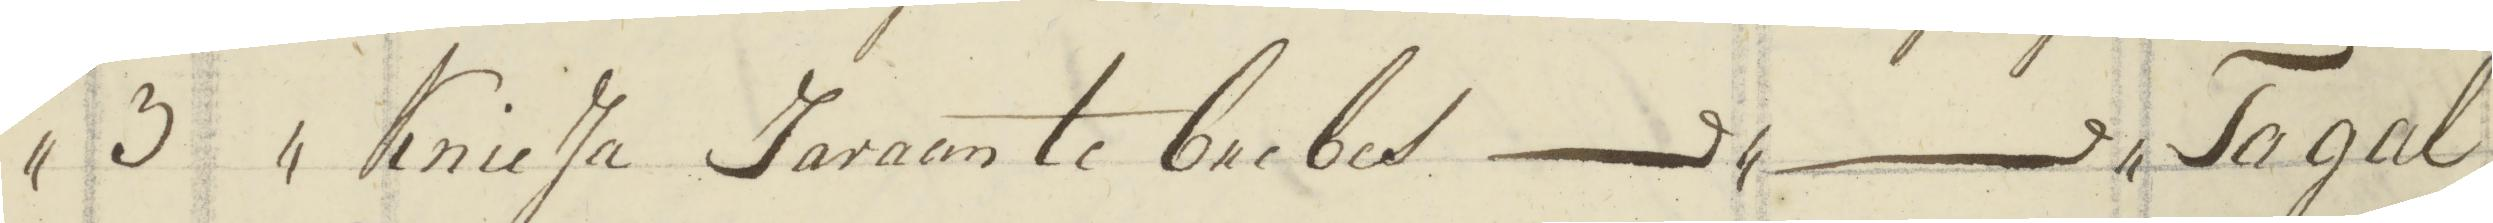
„ 3 „ knieja Iavaan te brebes Do „ Do „ Tagal
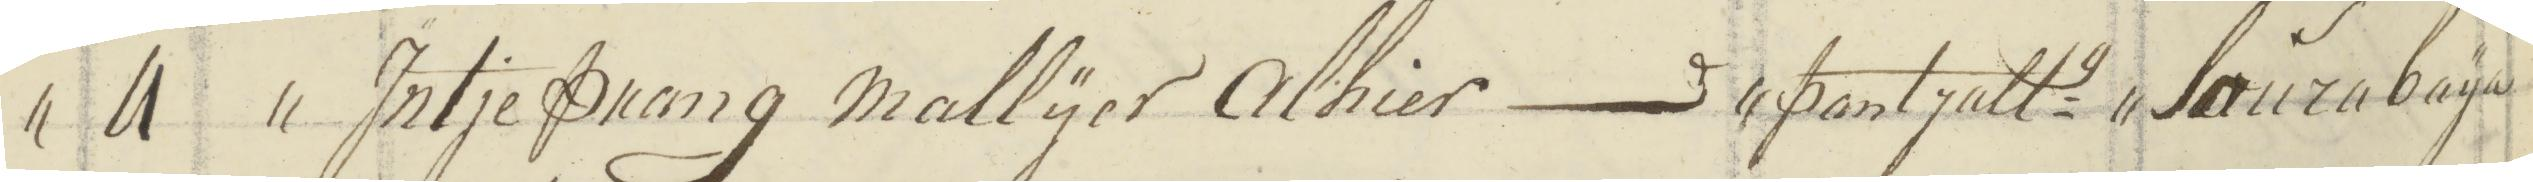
„ 4 „ Jntje Prang mallijer alhier Do „ pantjall=g „ sourabaija
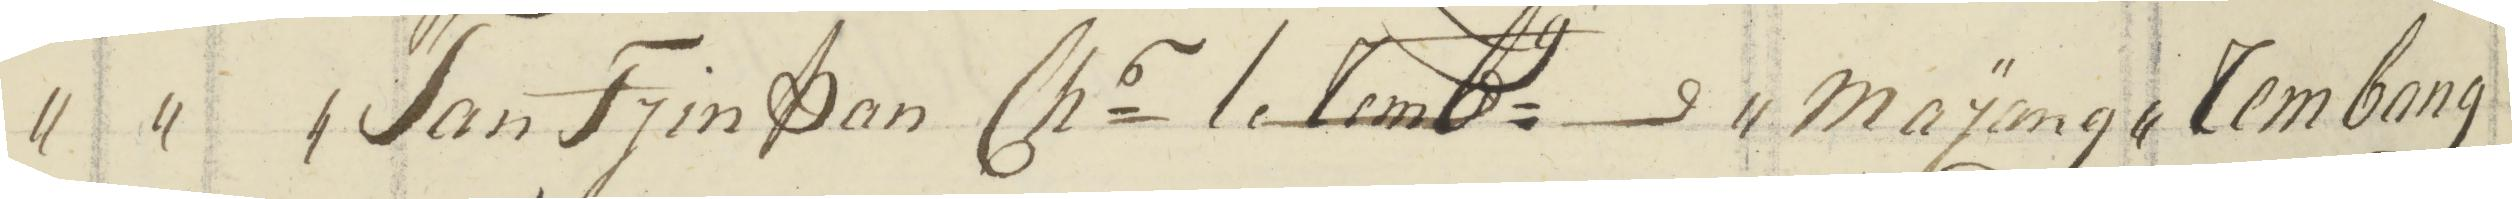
„ „ „ Tan Fjin Pan Ch=s te remb=g Do „ maijang „ Rembang
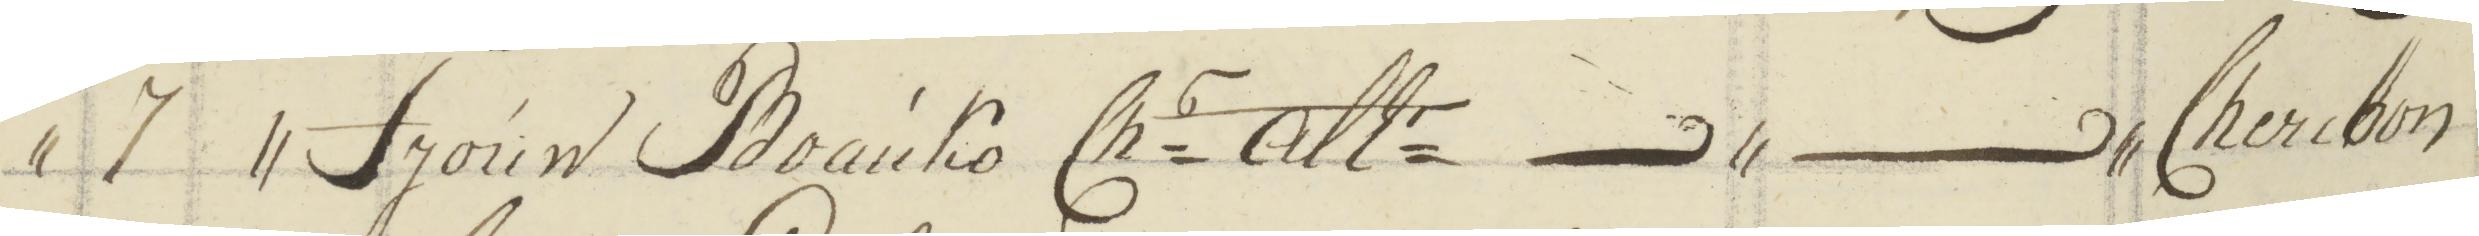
„ 7 „ Fjouw Boauko Ch=s alh=r Do „ Do „ Cheribon
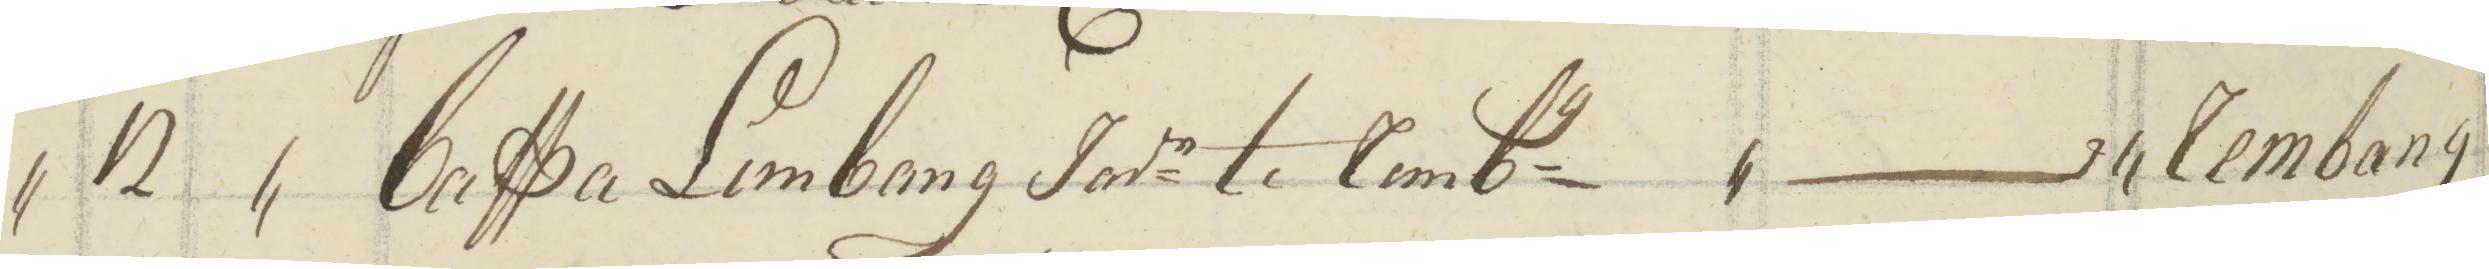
„ 12 „ bappa Limbang Iav=n te remb=g „ Do „ Rembang
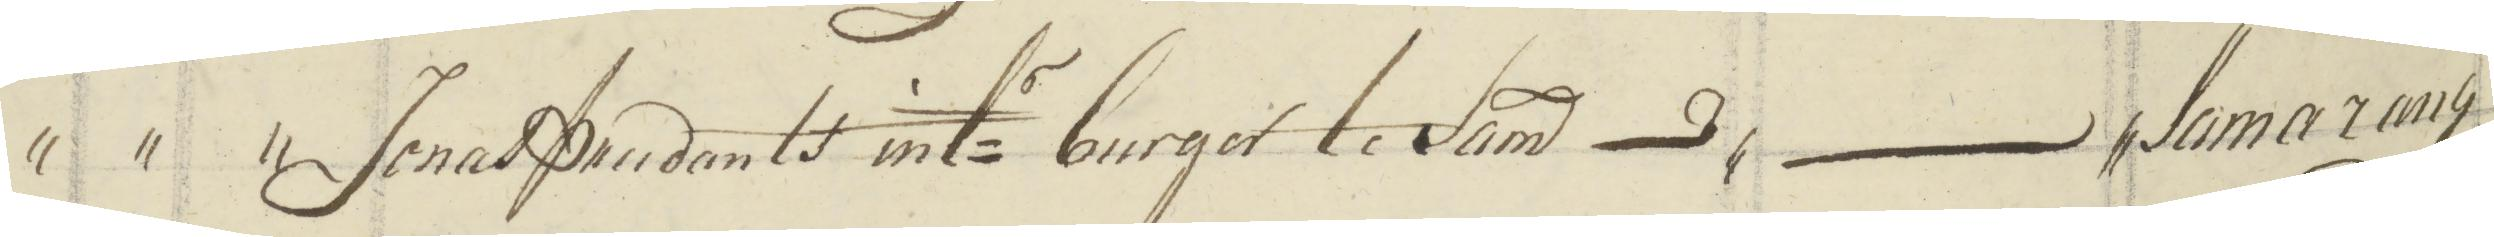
„ „ „ Jonas prudants int=s burger te sam Do „ — „ Samarang
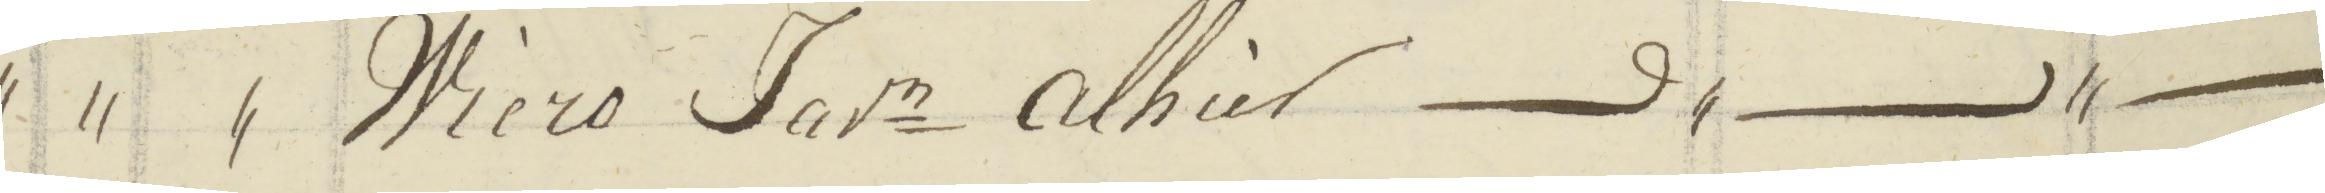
„ „ „ Wiero Iav=n alhier Do „ — „ Do
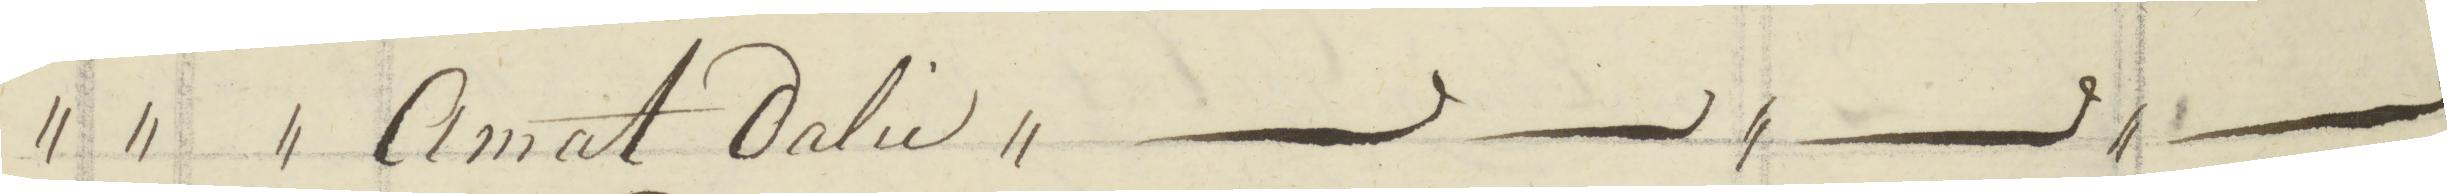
„ „ „ Amat dalie „ Do — „ Do „ Do
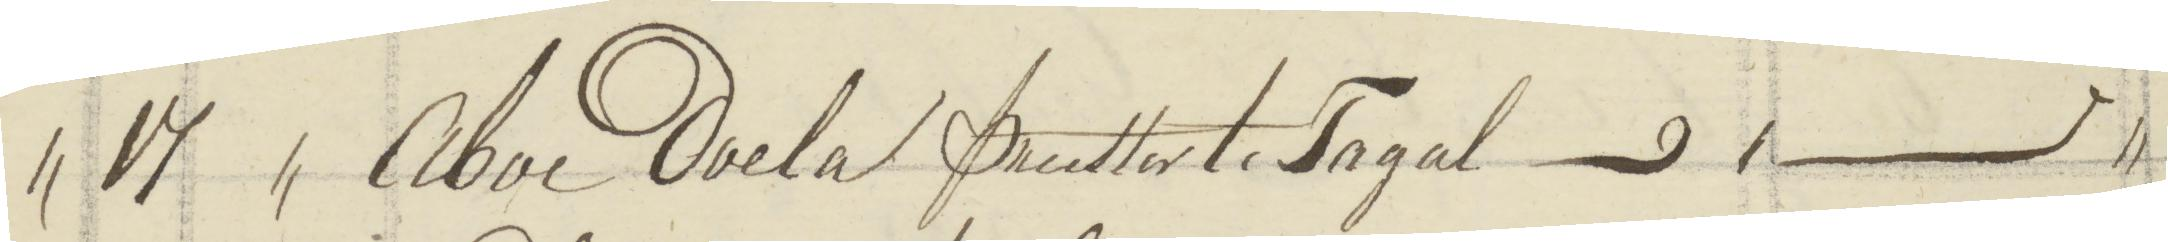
„ 17 „ Aboe doela pruster te Tagal Do „ Do „
